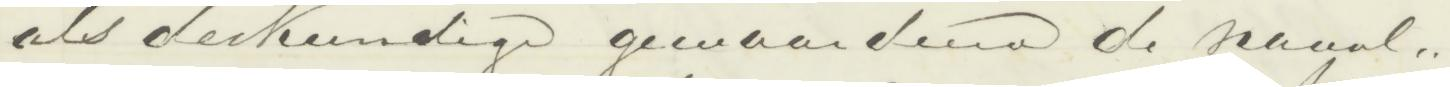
als deskundige gewaardeerd de navol„
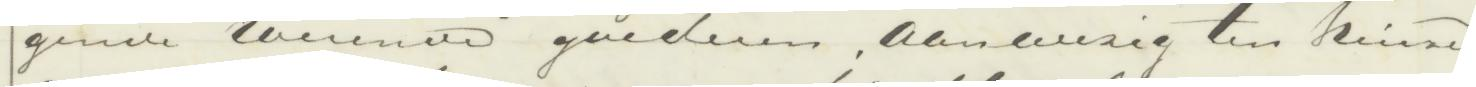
gende roerende goederen, aanwezig ten huize
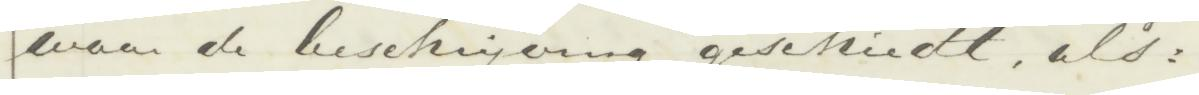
waar de beschrijving geschiedt, als:
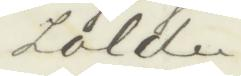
zolder
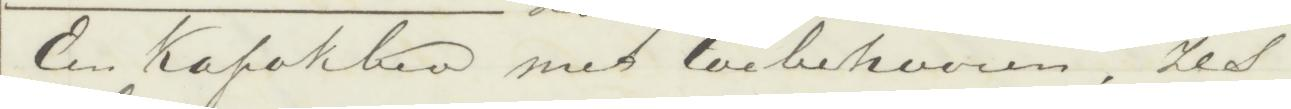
Een kapokbed met toebehooren, zes
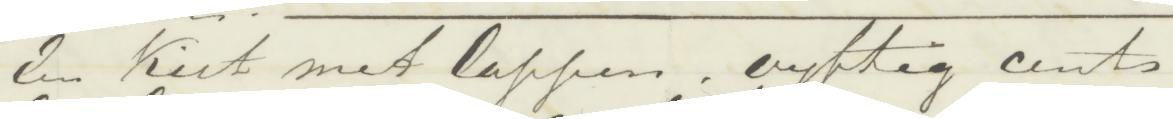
Een kist met lappen, vyftig cents
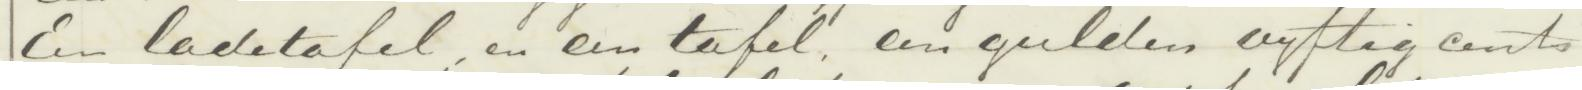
Een ladetafel, en een tafel, een gulden vyftig cent
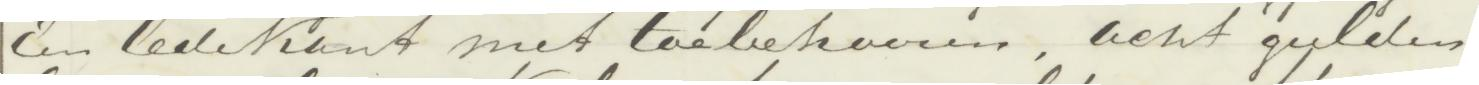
Een ledikant met toebehooren, acht gulden.
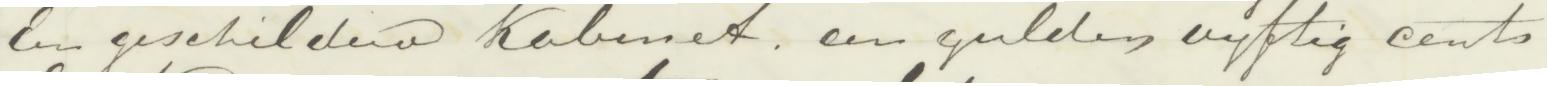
En geschilderd kabinet, een gulden vyftig cents
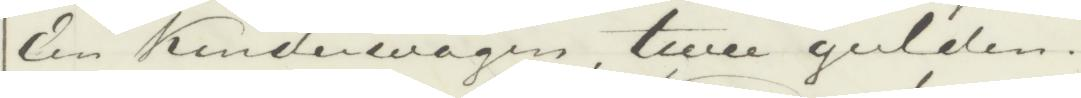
Een kinderwagen, twee gulden.
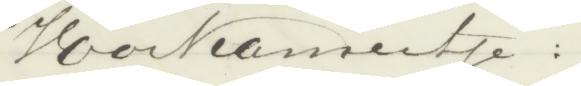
Voorkamertje :
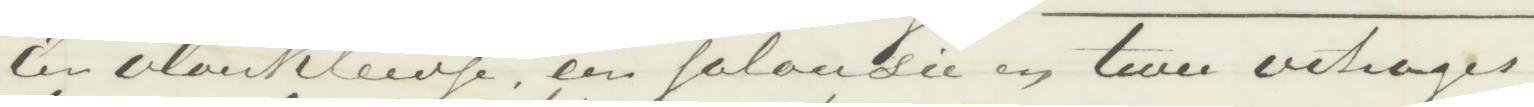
Een vloerkleedje, een jalousie en twee vitrages
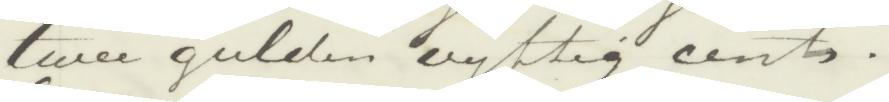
twee gulden vyftig cents.
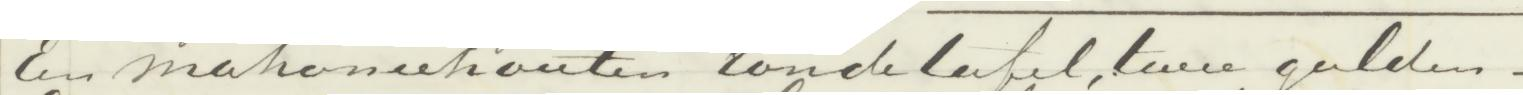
Een mahoniehouten ronde tafel, twee gulden.
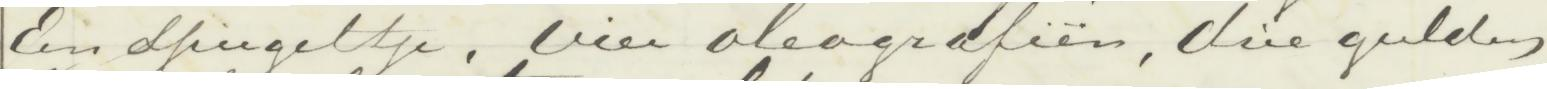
Een spiegeltje, vier oleografiën, drie gulden
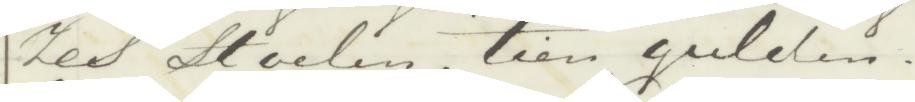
Zes stoelen, tien gulden.
